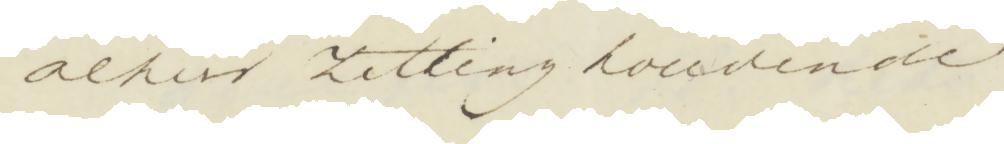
alhier zitting houdende.
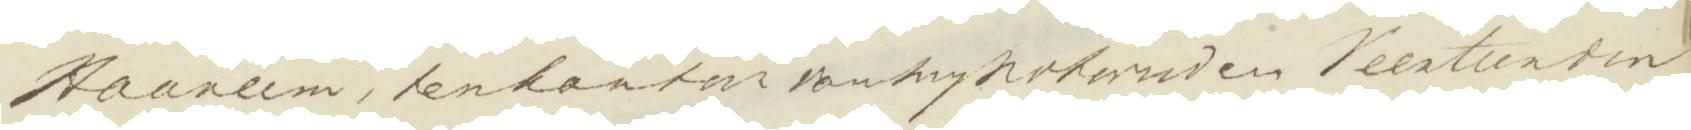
Haarlem, ten kantore van my notaris den Veertienden
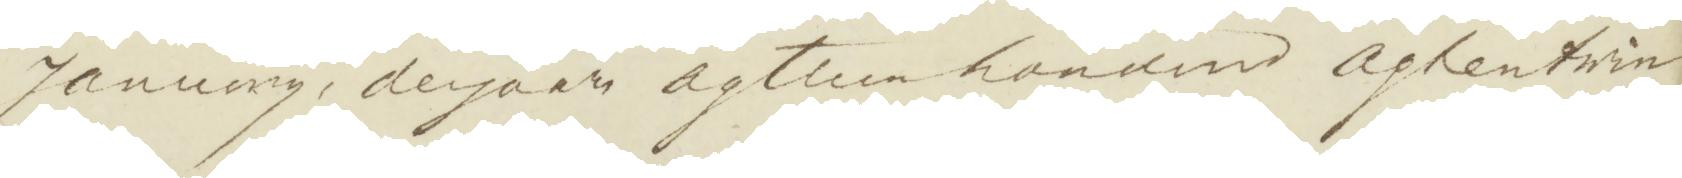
January, desjaars agttien honderd agtentwin
